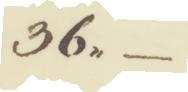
36„ —
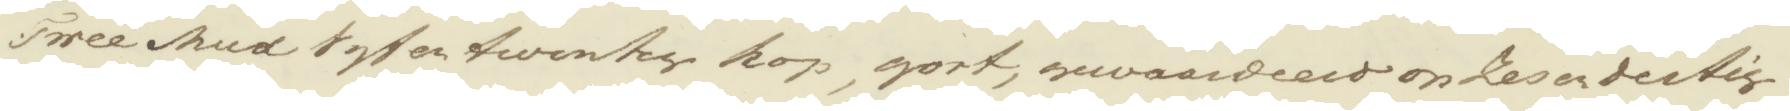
Twee Mud vyf en twintig kop, gort, gewaardeerd op zes en dertig
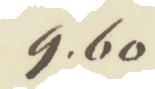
9.60
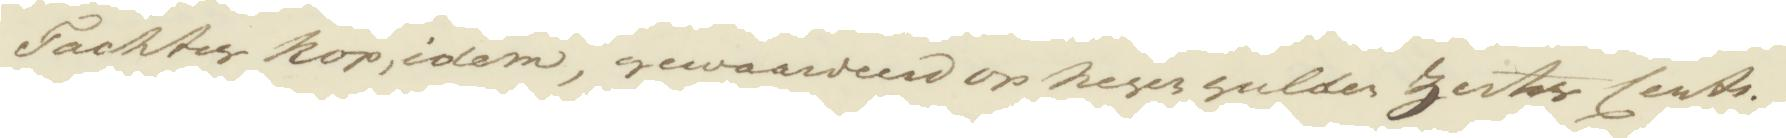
Tachtig kop, idem, gewaardeerd op negen gulden Zestig Cents.
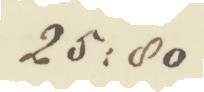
25:80
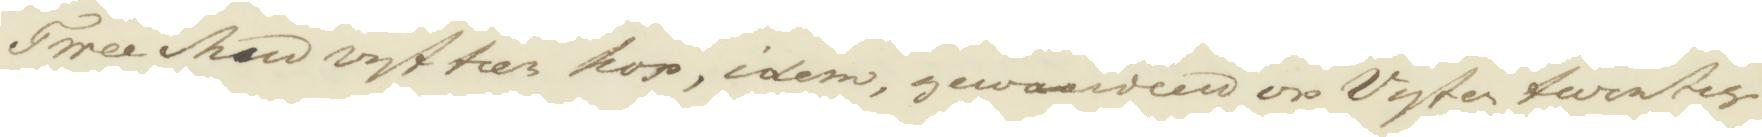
Twee Mud vyftien kop, idem, gewaardeerd op Vyfen twintig
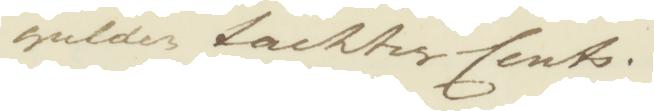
gulden tachtig Cents.
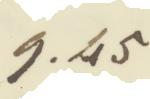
9.45
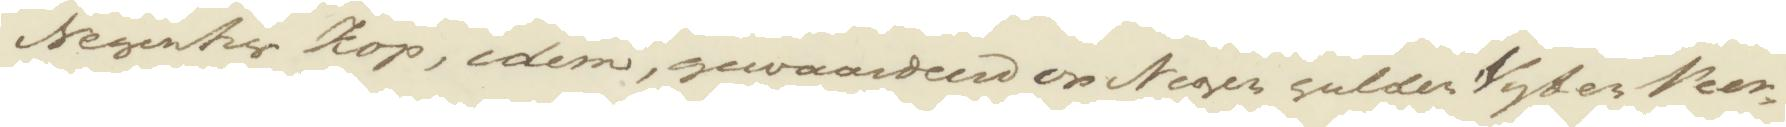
Negentig Kop, idem, gewaardeerd op Negen gulden Vyf en Veer„
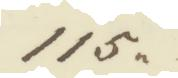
115„
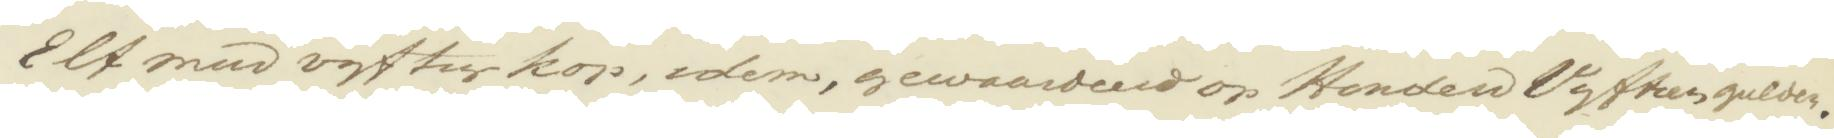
Elf mud vyftig kop, idem, gewaardeerd op Honderd Vyftien gulden
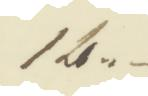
14„ -
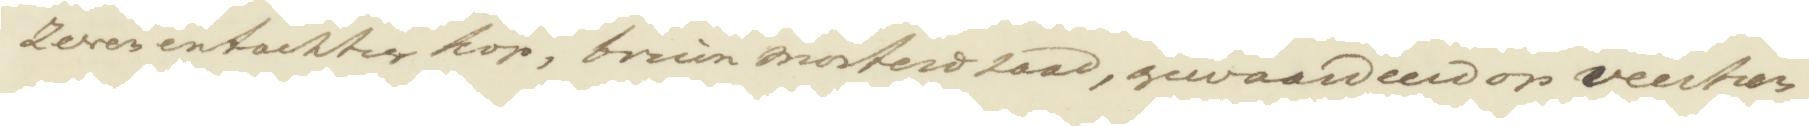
Zeven en tachtig kop, bruin mosterd zaad, gewaardeerd op veertien
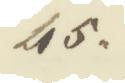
45„
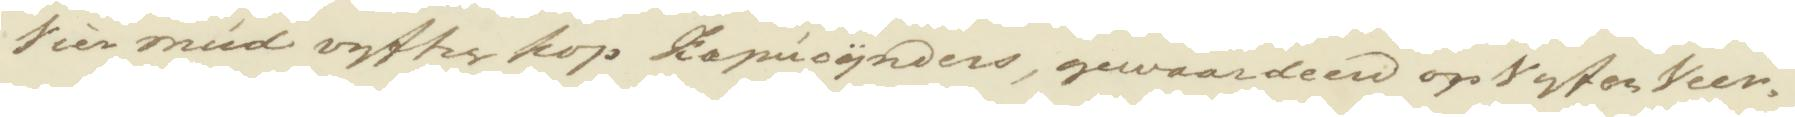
Vier mud vyftig kop Kapucijnders, gewaardeerd op Vyf en Veer„
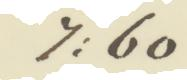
7: 60
